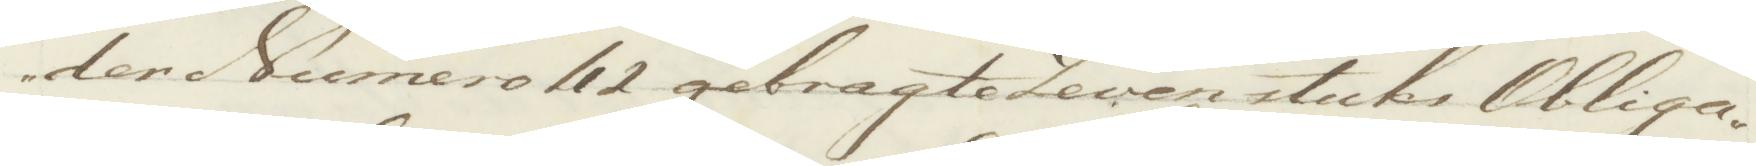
„der Numero 42 gebragte Zeven stuks Obliga„
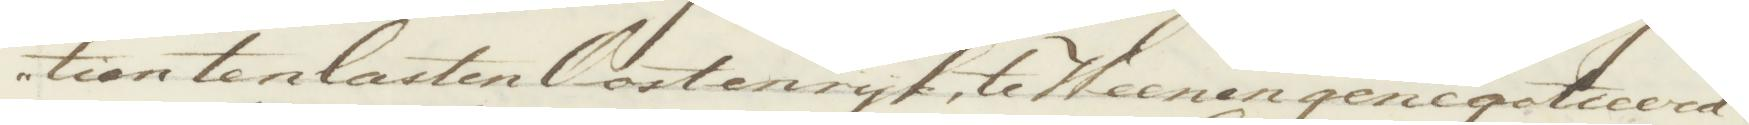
„tien ten lasten Oostenrijk, te Weenen genegotieerd
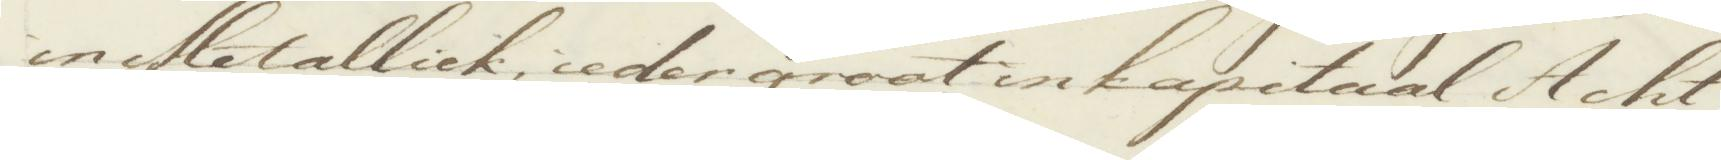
in Metalliek, ieder groot in kapitaal Acht
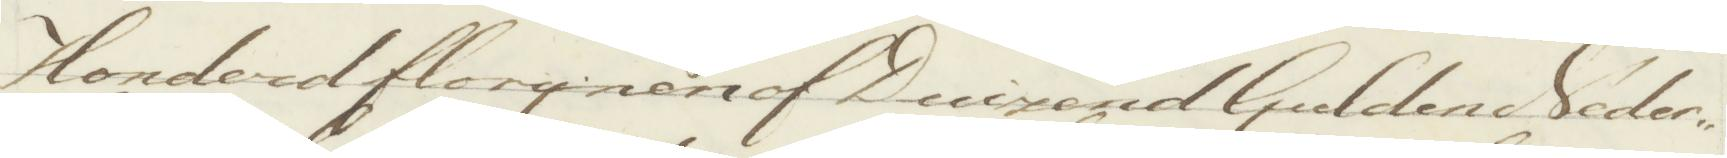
Honderd florijnen of Duizend Gulden Neder„
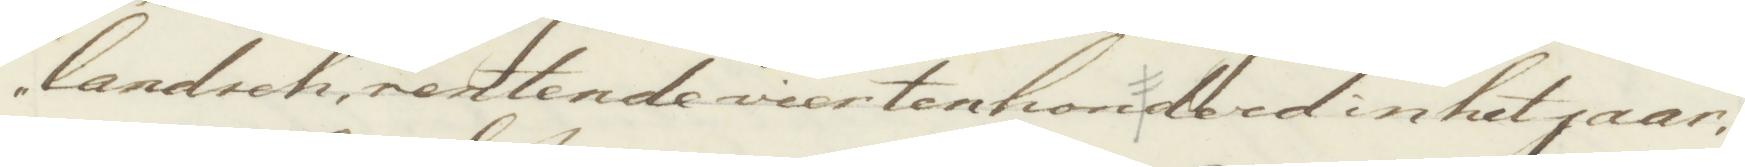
„landsch, rentende vier ten hon|derd in het jaar,
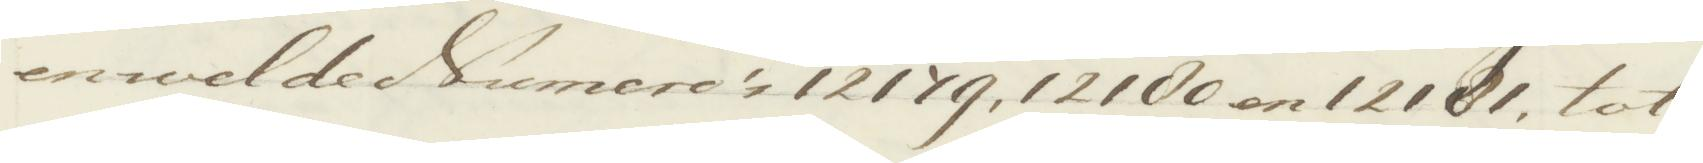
en wel de Numero 's 12179, 12180 en 12181, tot
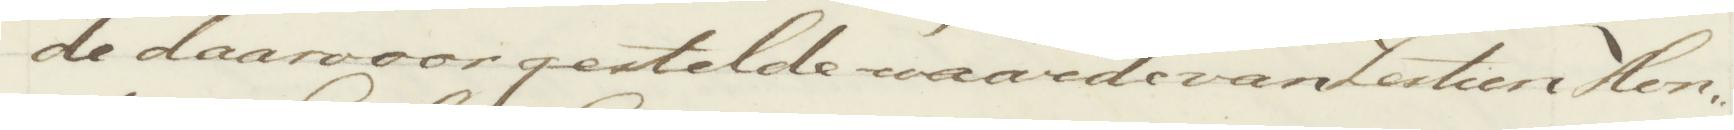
de daarvoor gestelde waarde van Zestien Hon„
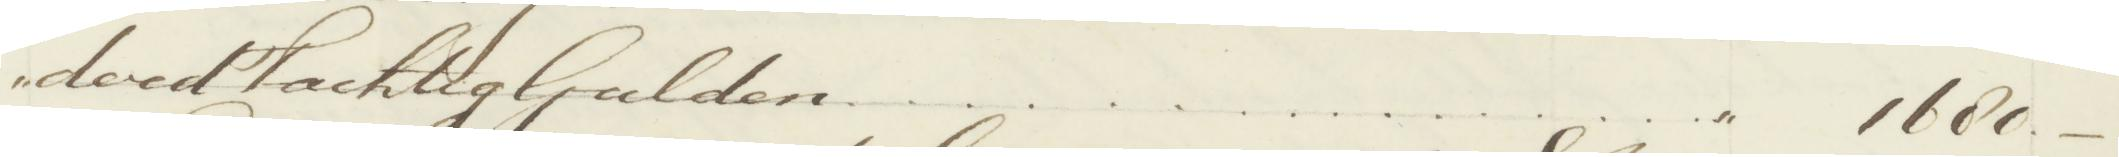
„derd Tachtig Gulden. . . . . . . . . . . . . . . . „ 1680. —
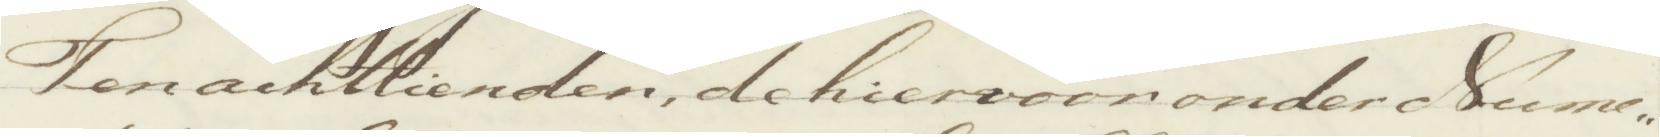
Ten achttienden, de hiervoor onder Nume„
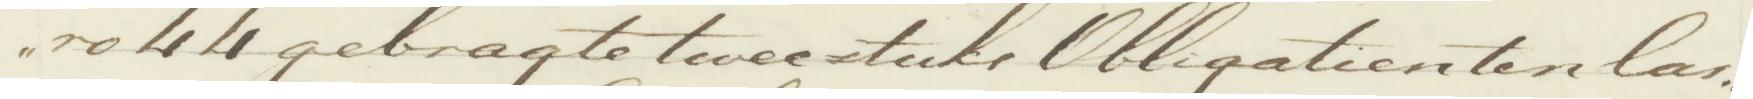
„ro 44 gebragte twee stuks Obligatien ten las„
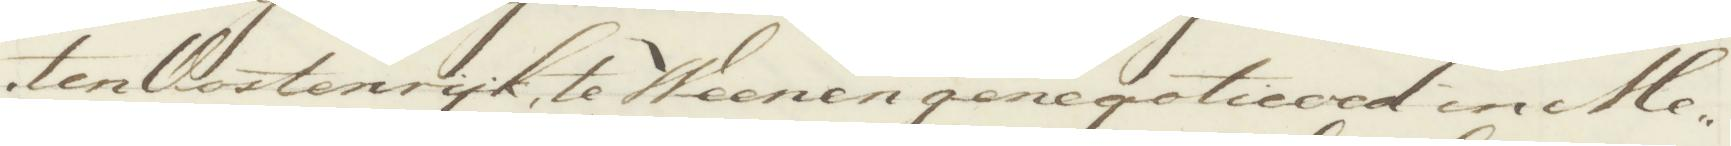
„ten Oostenrijk, te Weenen genegotieerd in Me„
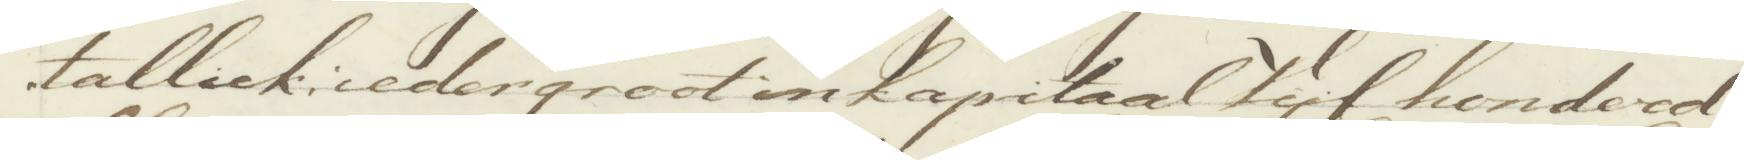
„talliek, ieder groot in kapitaal Vijf honderd
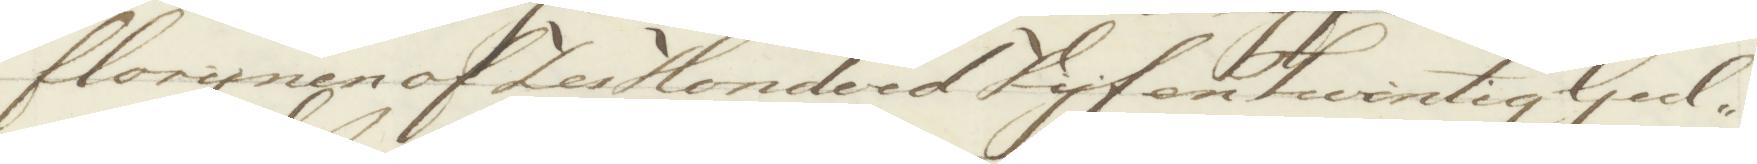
florijnen of Zes Honderd Vijf en Twintig Gul„
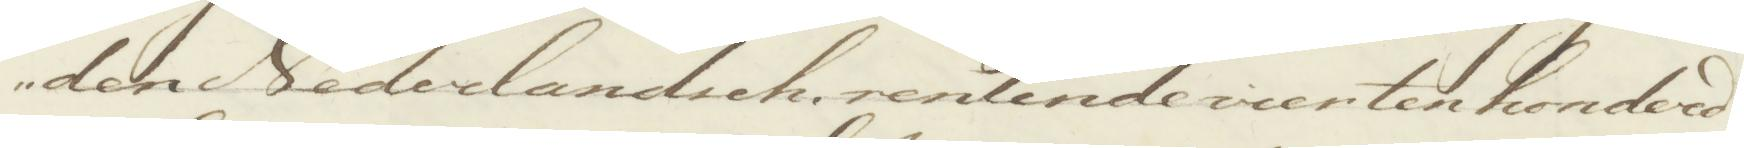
„den Nederlandsch, rentende vier ten honderd
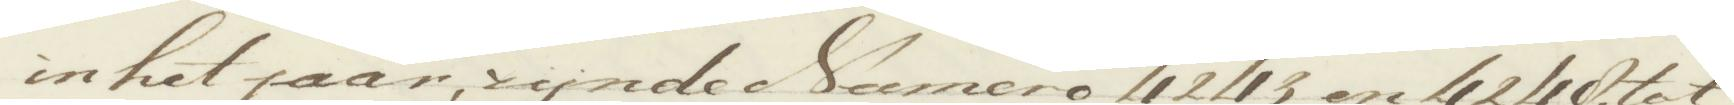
in het jaar, zijnde Numero 4243 en 4248, tot
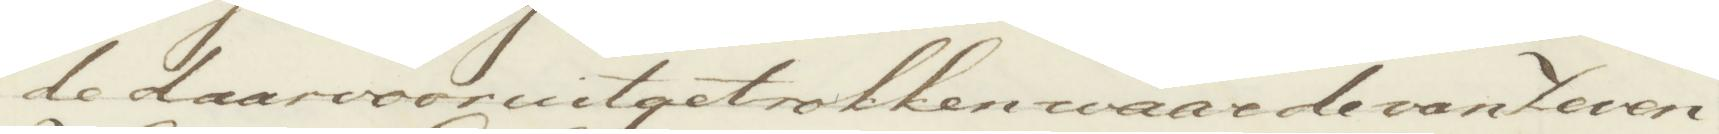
de daarvoor uitgetrokken waarde van Zeven
